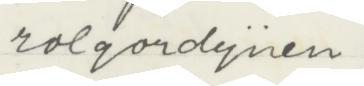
rolgordijnen
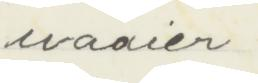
waaier
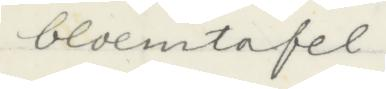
bloemtafel
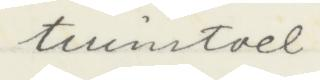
tuinstoel
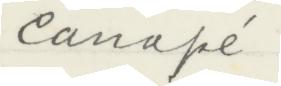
Canapé
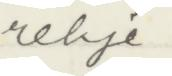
rekje
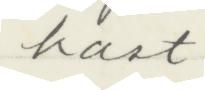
kast
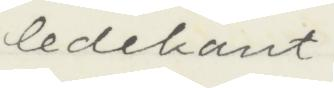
ledikant
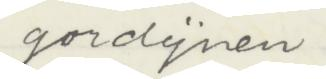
gordijnen
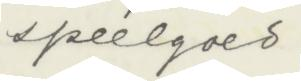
speelgoed
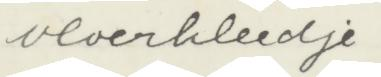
vloerkleedje
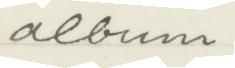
album
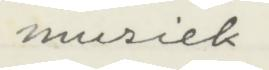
muziek
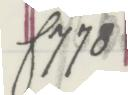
ƒ778
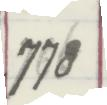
778
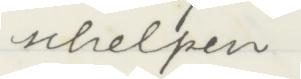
schelpen
